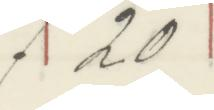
ƒ 20
